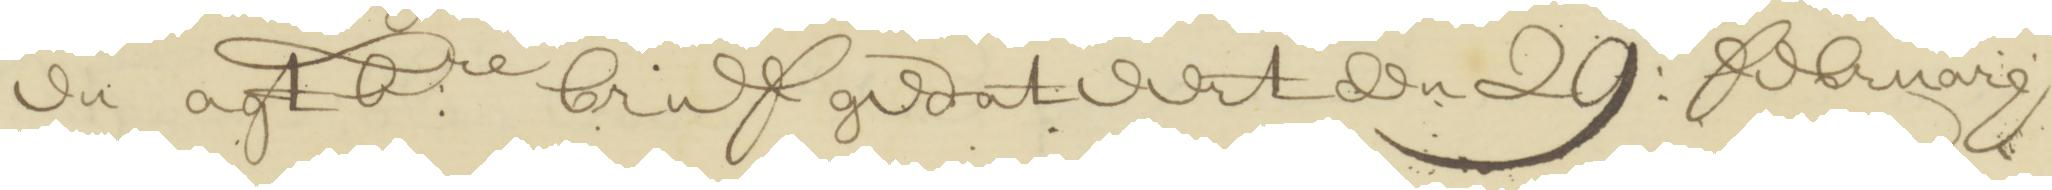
en agtb:re brief gedateert den 29:' Febuarij
